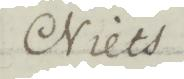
Niets
